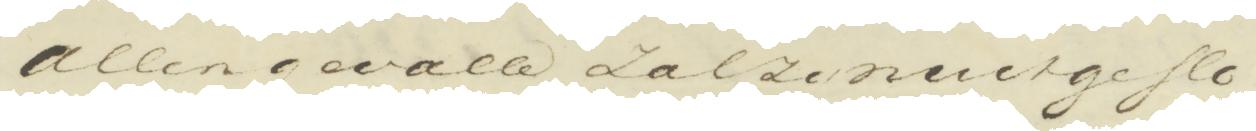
Allen gevalle zal zyn uitgeslo
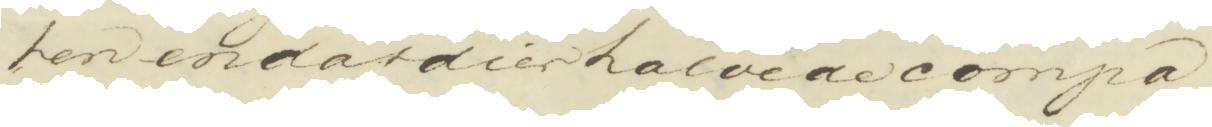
ten en dat dierhalve de compa
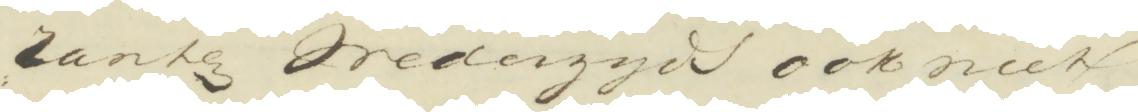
ranten Wederzyds ook niet
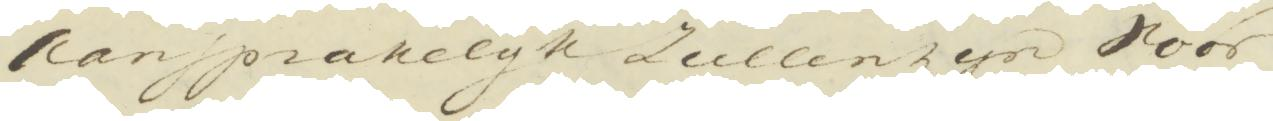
aansprakelyk zullen zyn voor
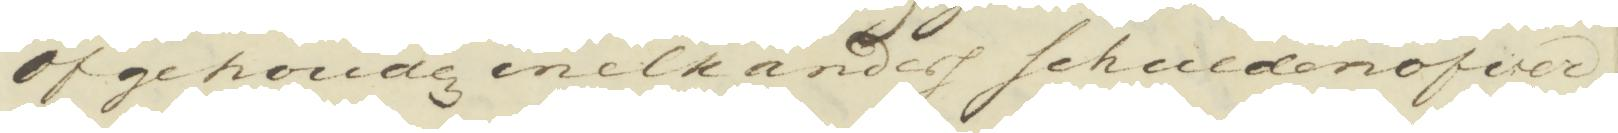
of gehouden in elkanders schulden of ver
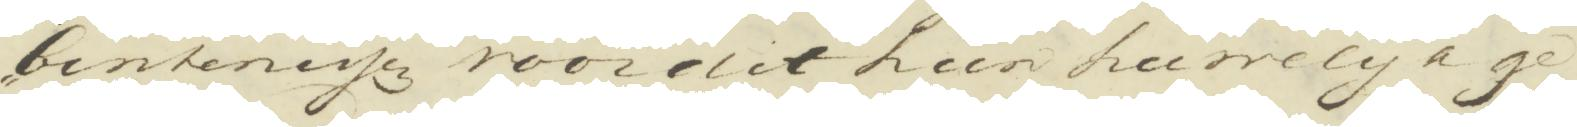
„bintenissen voor dit hun huwelyk ge
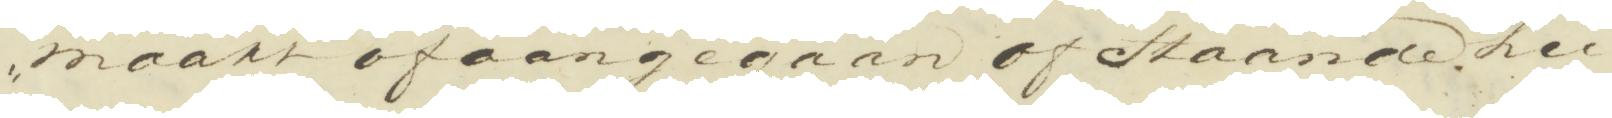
„maakt of aangegaan of staande. hu
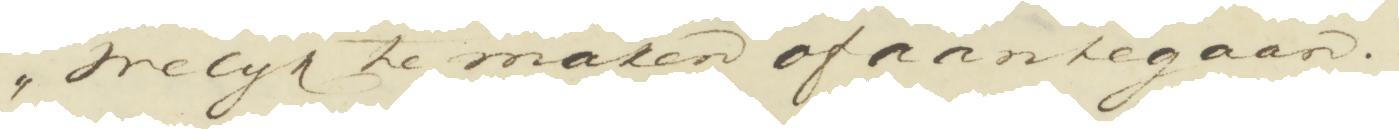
„welyk te maken of aantegaan.
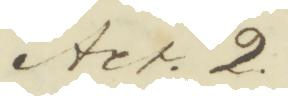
Art. 2.
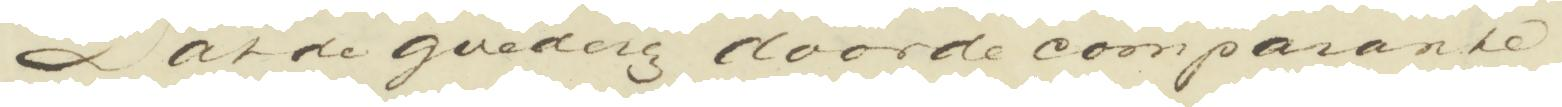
Dat de goederen door de comparante
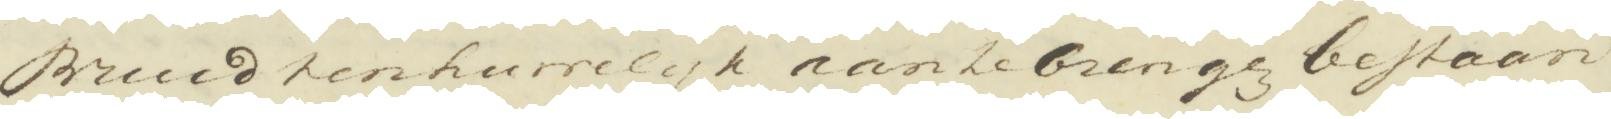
Bruid ten huwelyk aan te brengen bestaan
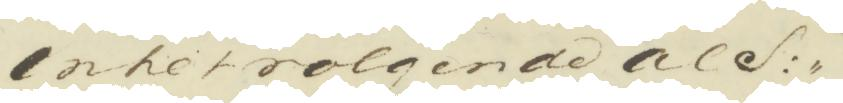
in het volgende als:„
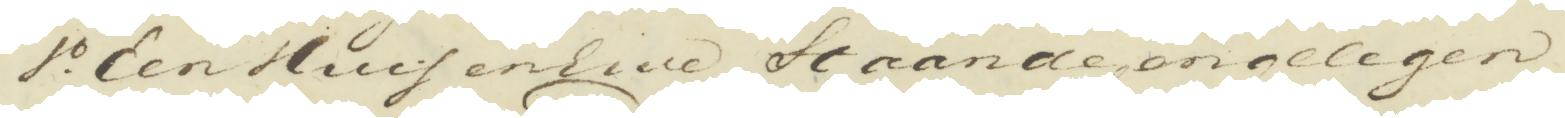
1.o Een Huis en erve staande, en gelegen
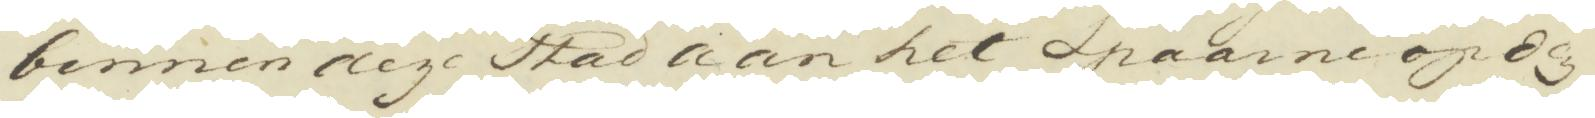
binnen deze Stad aan het Spaarne op den
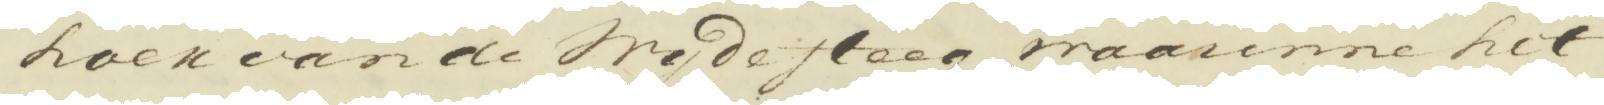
hoek van de Wydesteeg waarinne het
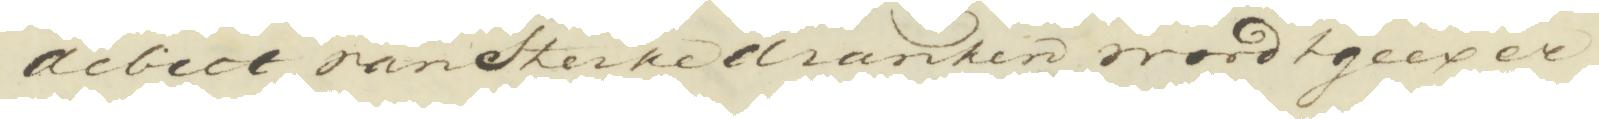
debiet van sterke dranken wordt geexer
